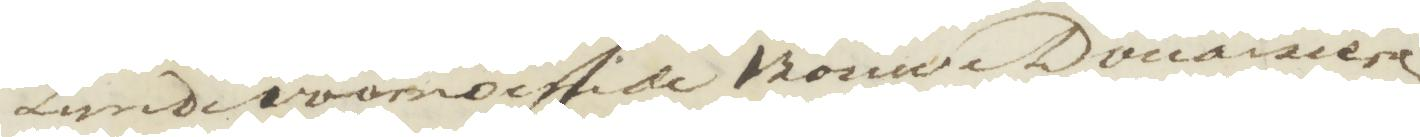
zynde voornoemde vrouwe Douarriere
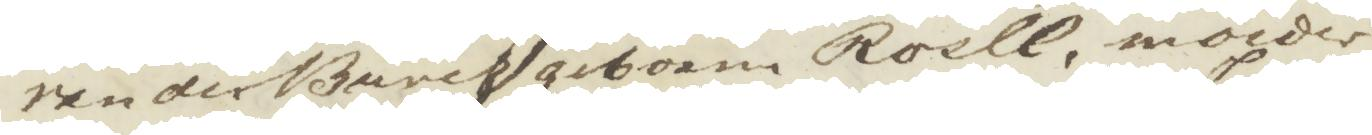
van der Burch geboren Roell, moeder
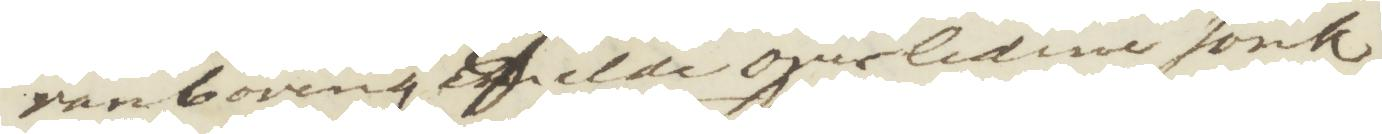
van bovengemelde overledene Jonk
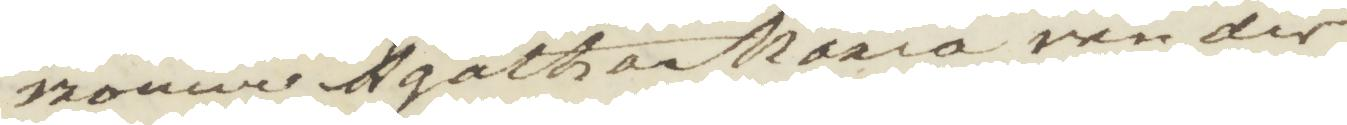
vrouwe Agatha Maria van der
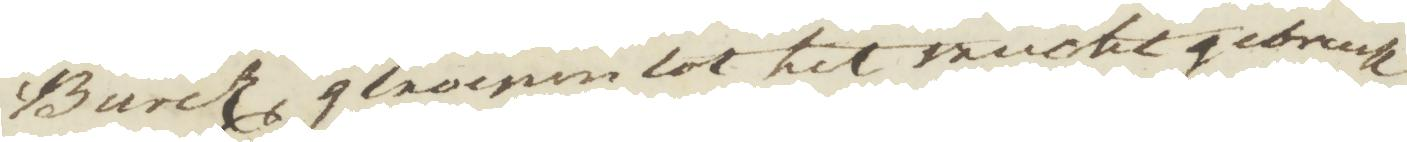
Burch, geroepen tot het vruchtgebruik
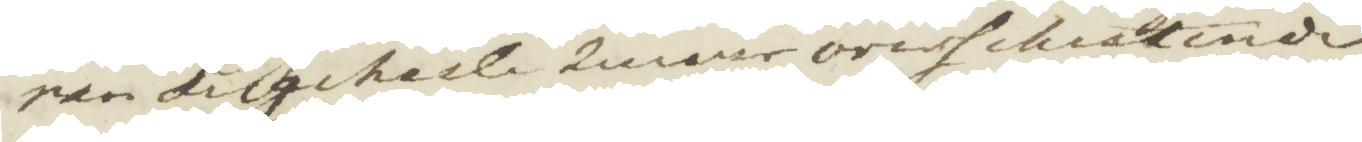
van de geheele zuiver overschietende
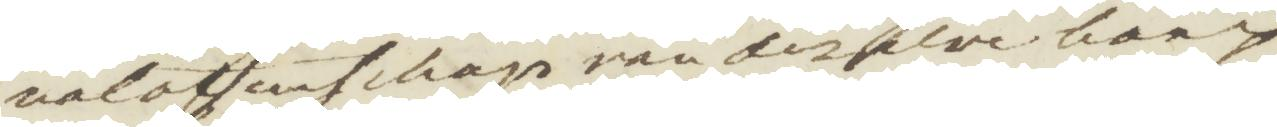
nalatenschap van dezelve haar
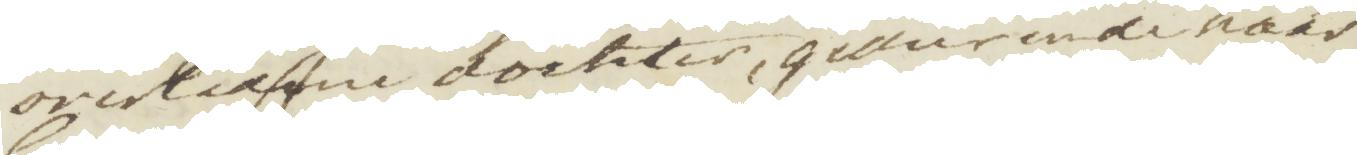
overledene dochter, gedurende haar
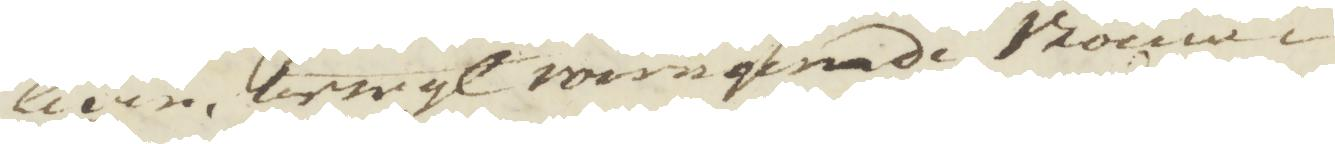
leven, terwyl voornoemde Vrouwe
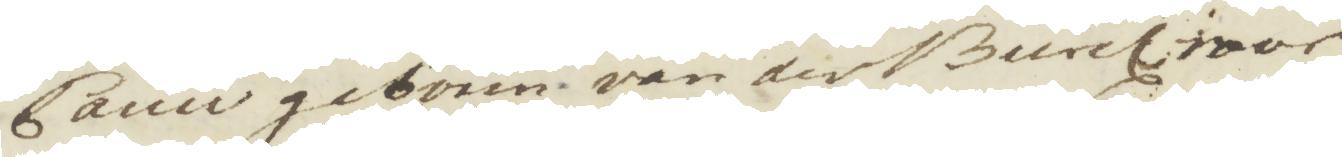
Pauw geboren van der Burch voor
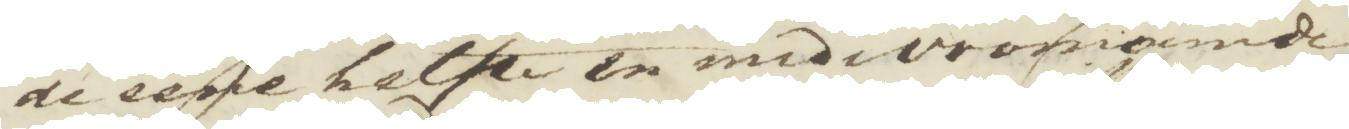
de eene helfte en midi voornoemde
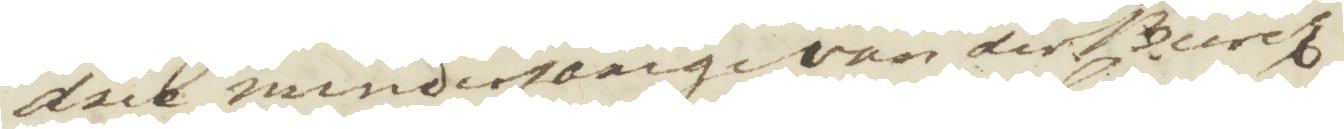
drie minderjarige van der Burch,
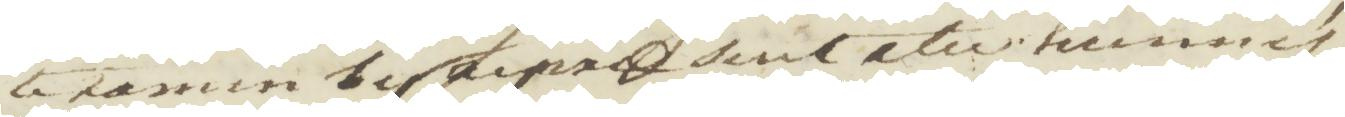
te zamen by representatie hunnes
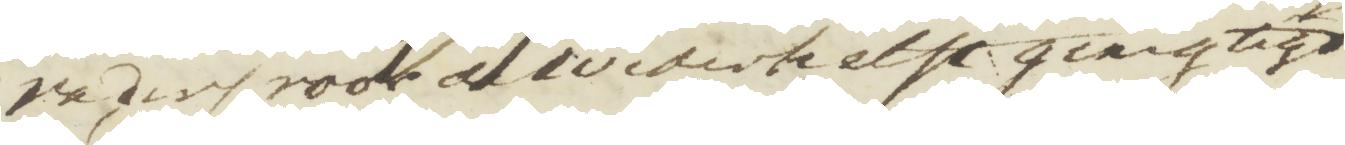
vaders, voor de wederhelft geregtigd
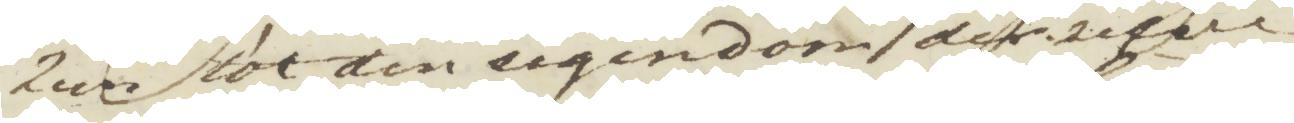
zyn tot den eigendom der zelve
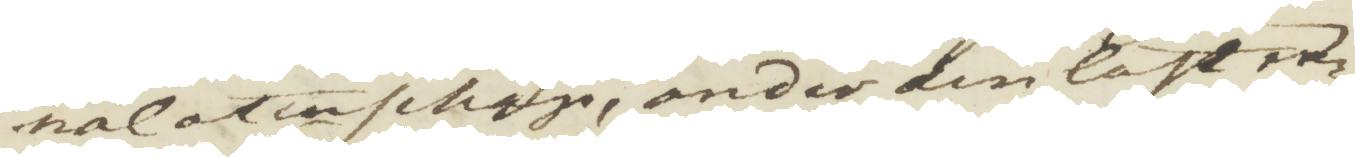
nalatenschap, onder den last van
